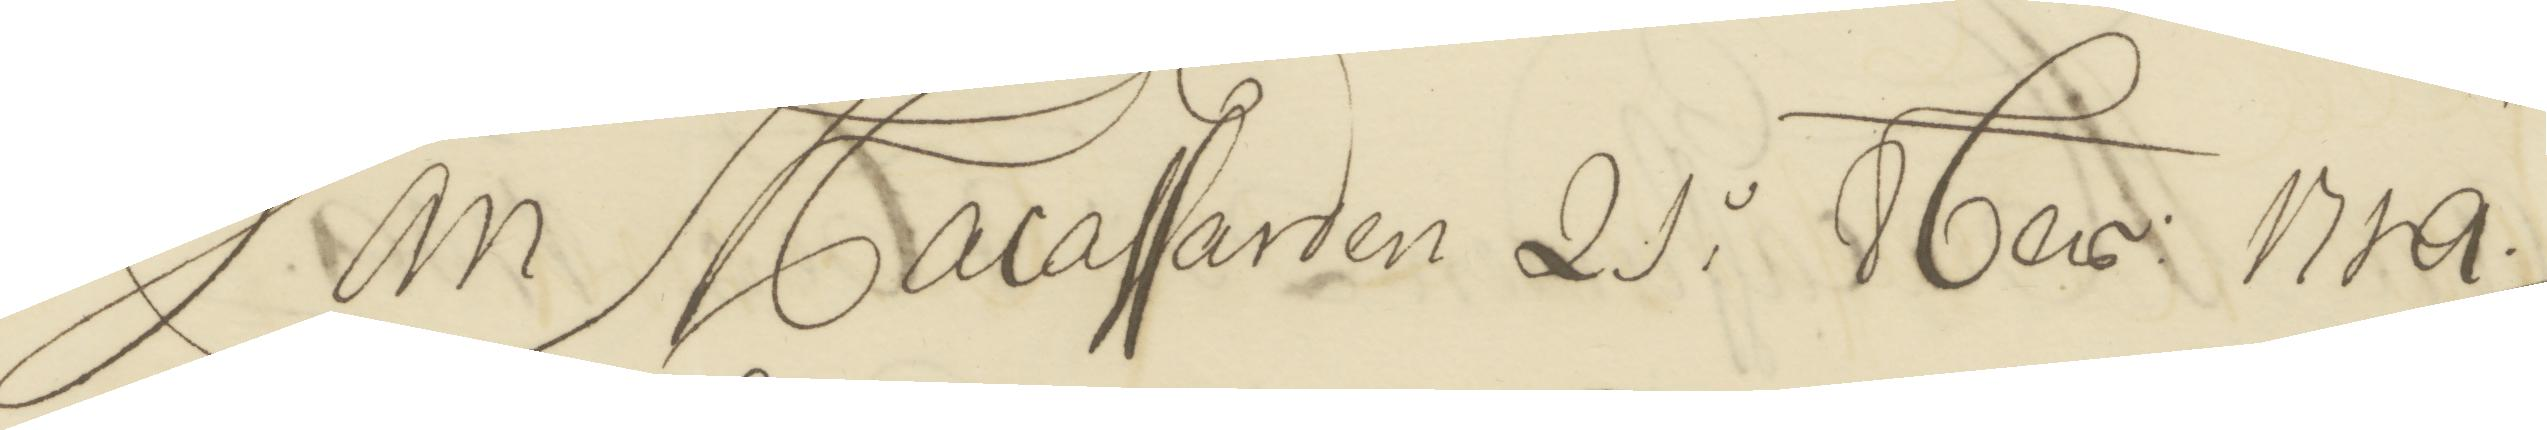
Van Macassar den 21:e 8ber: 1714.
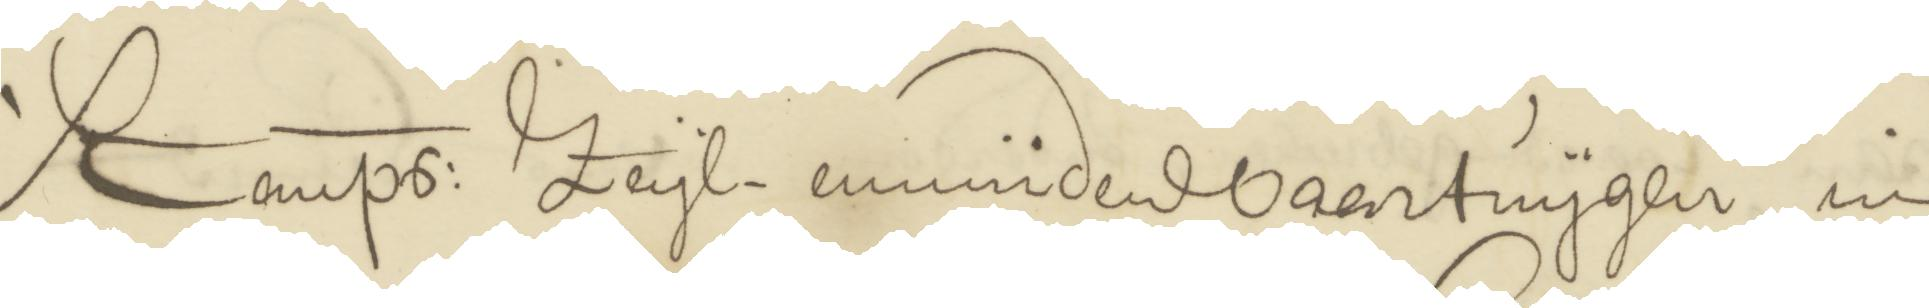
'SComps: Zeijl- en minderevaertuijgen in
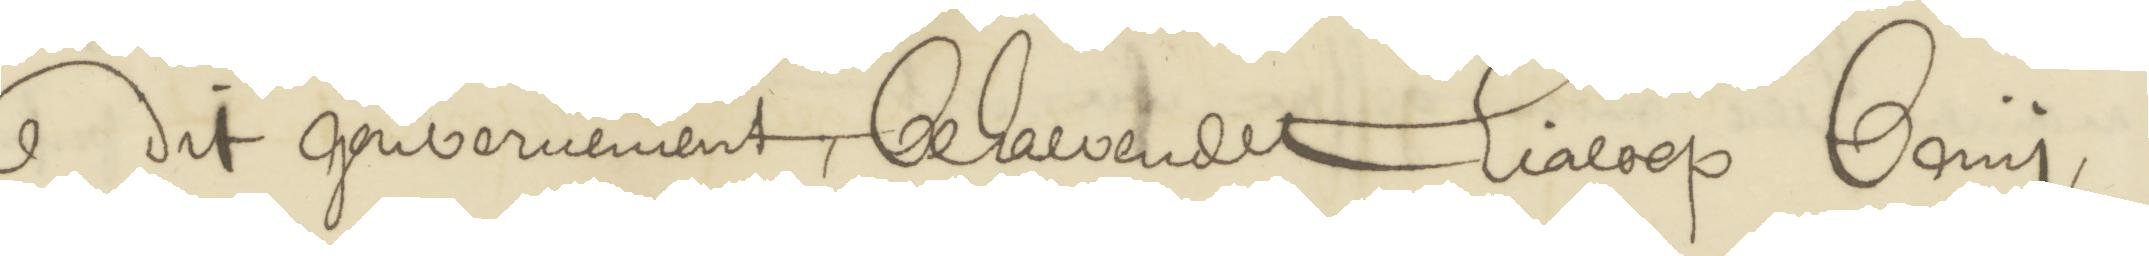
dit gouvernement, behalvende Chialoep Bonij,
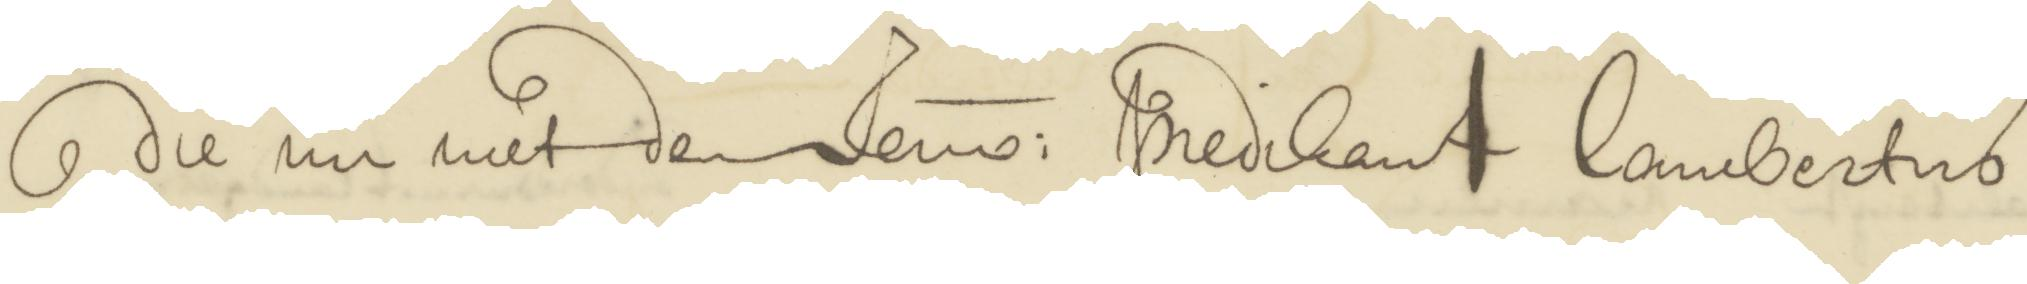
die nu met den Eenv: predikant lambertus
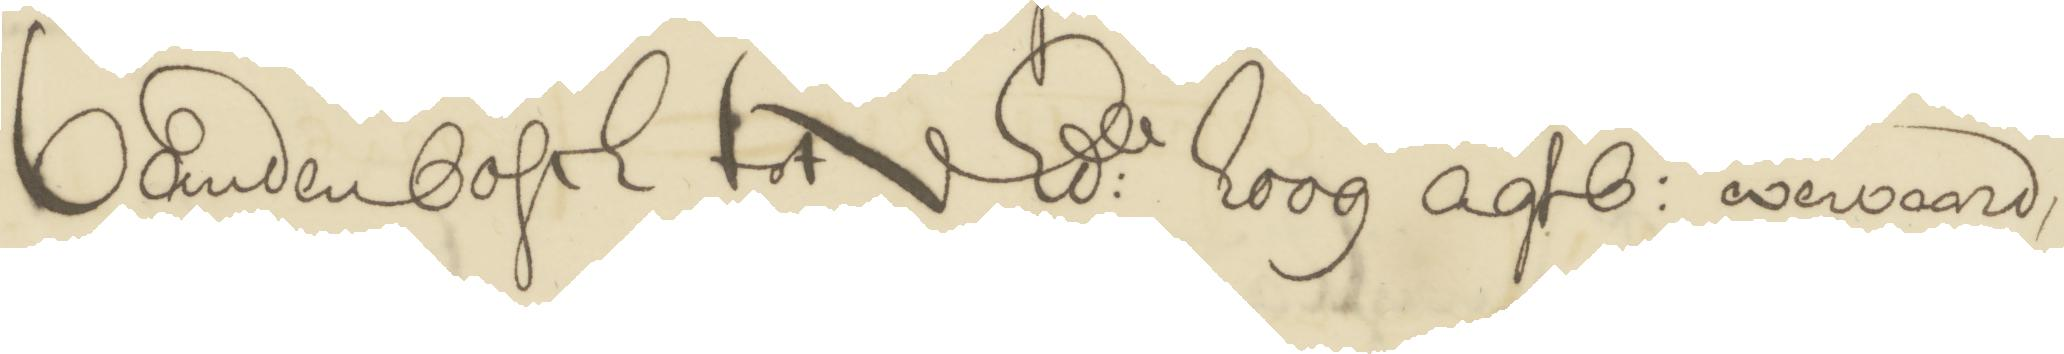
Vanden bosch tot VEd:le hoog agtb: overvaard,
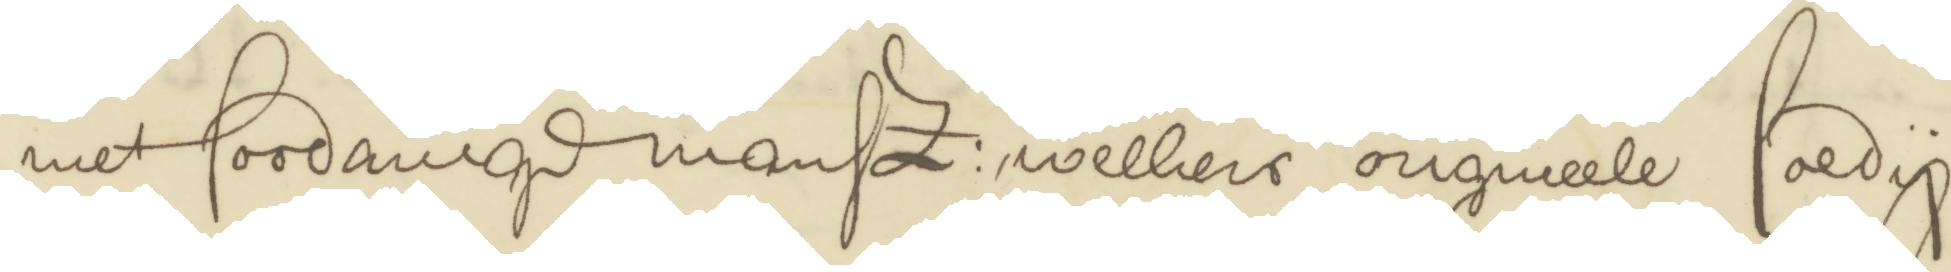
met soodanige mansz: welkers origineele soldij
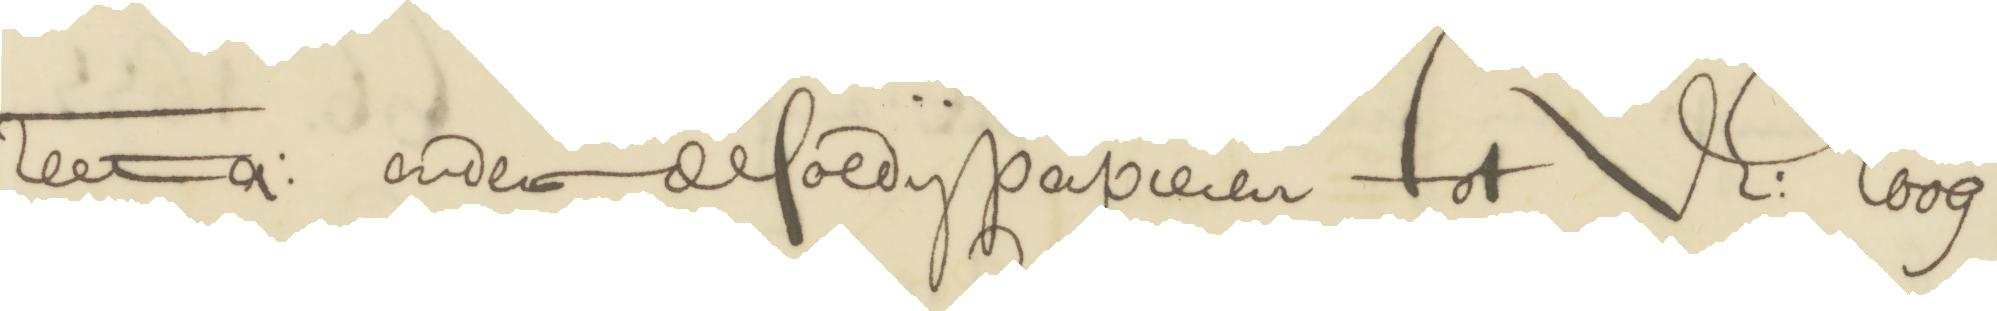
reecq: onder de soldij papieren tot VE: hoog
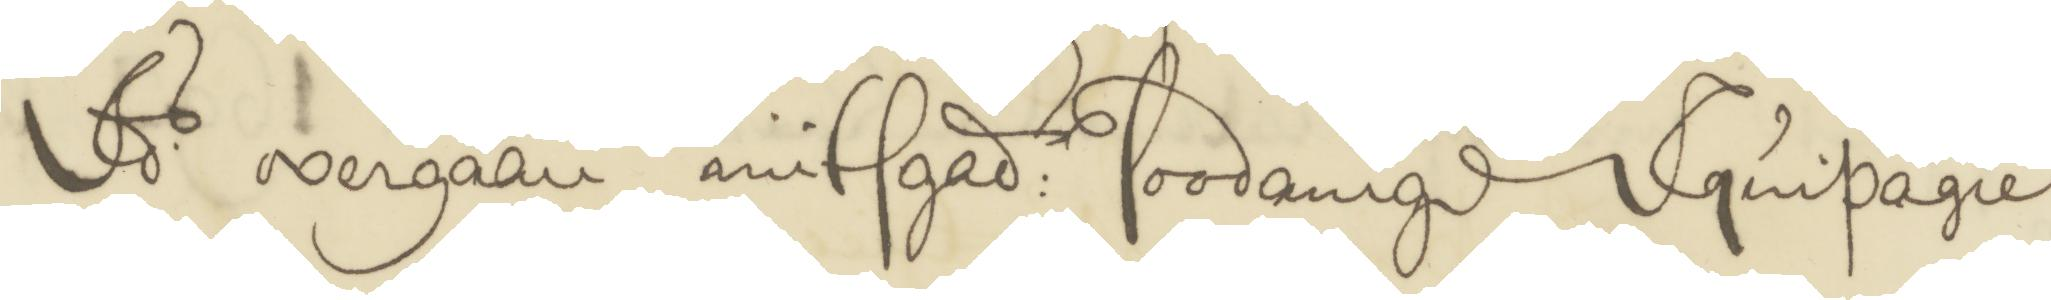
Ed:s overgaan mitsgad:rs soodanige Equipagie
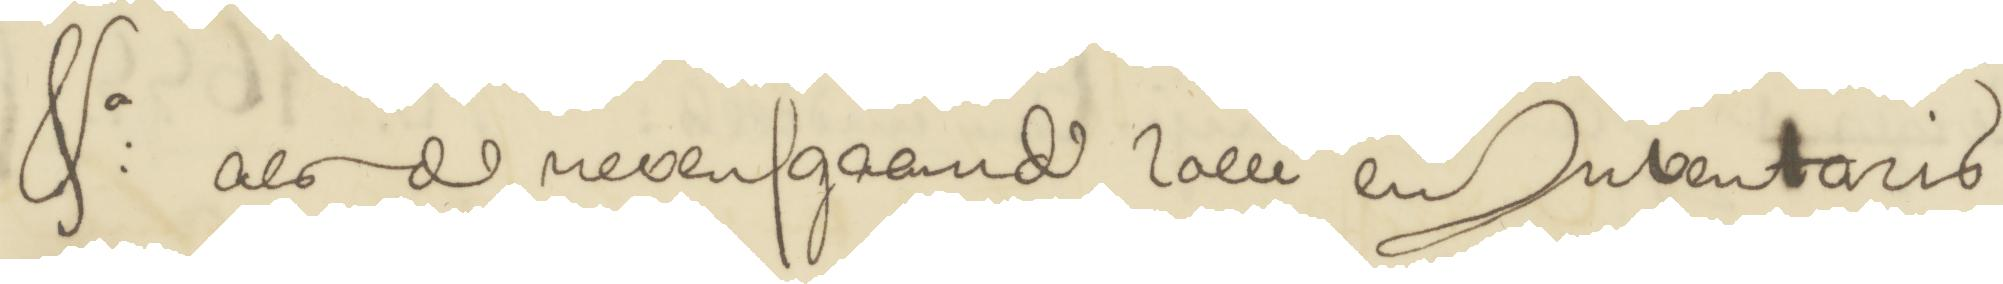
&:a als de nevensgaande rolle en Jnventaris
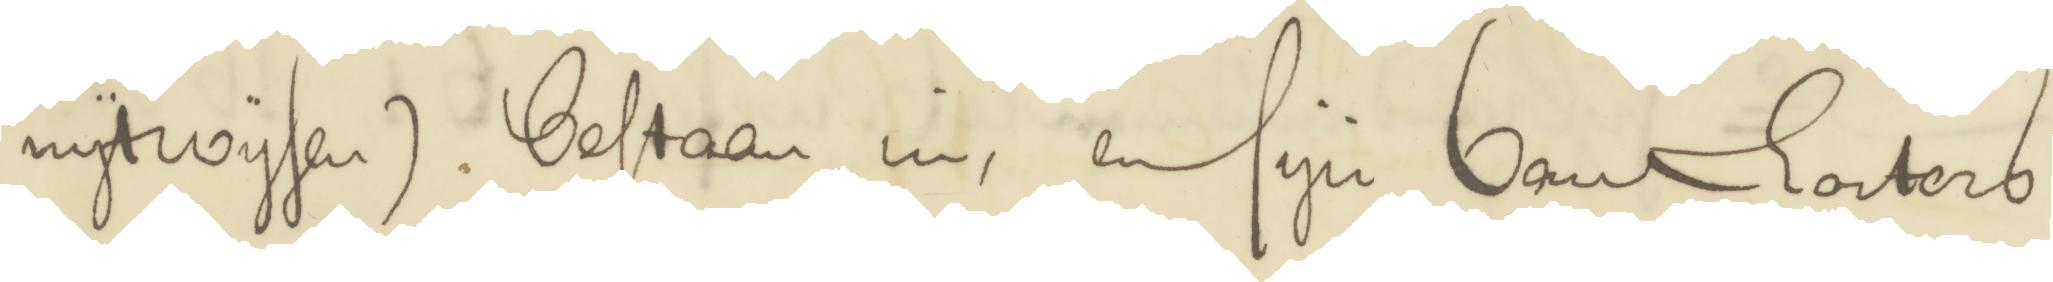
uijtwijsen). bestaan in, en sijn van charters
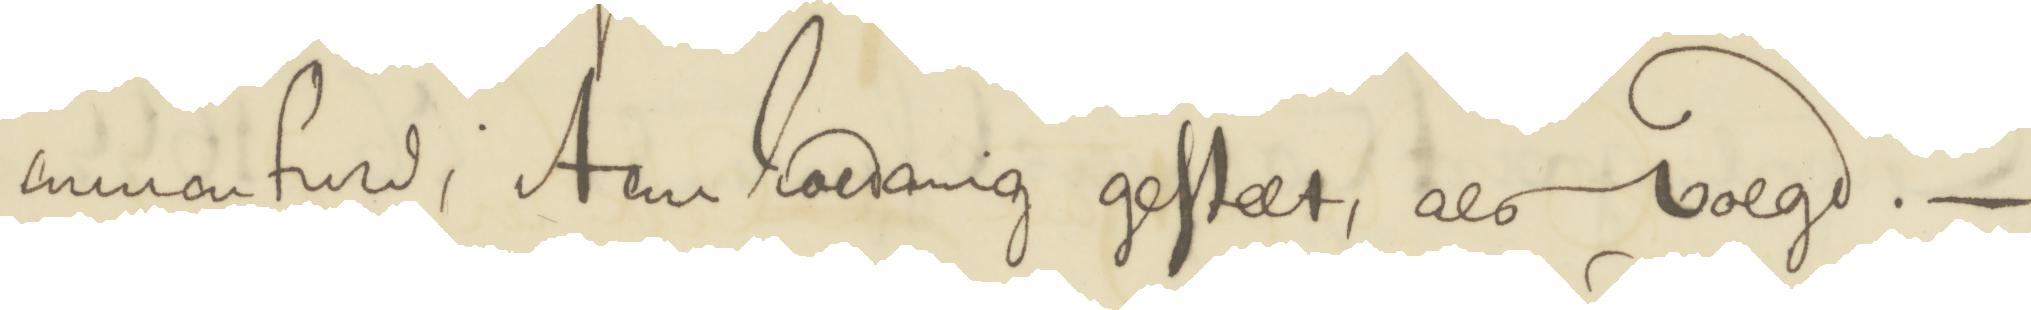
enmansure; Aen hoedanig gestelt, als volgd. —
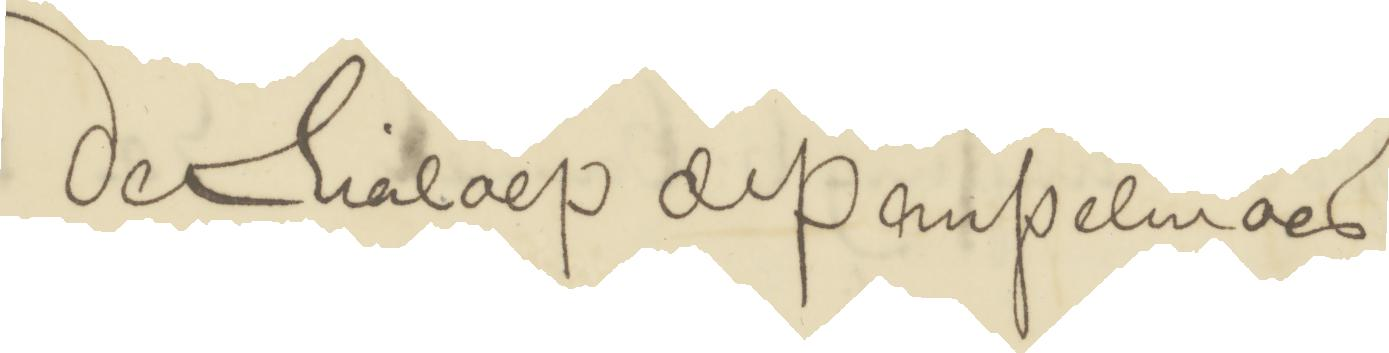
de chialoep de pampelmoes
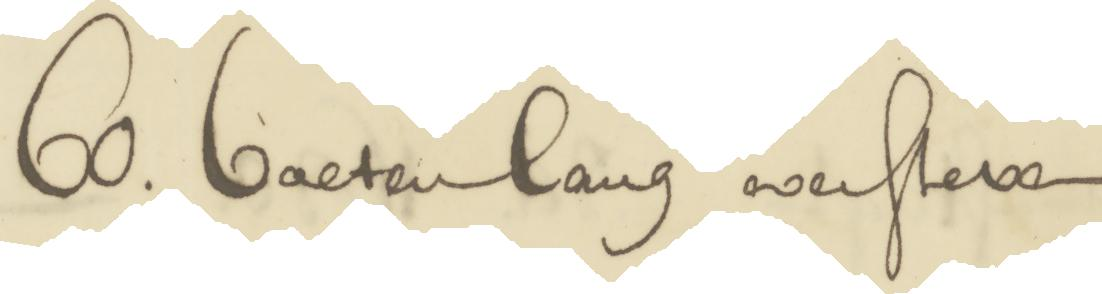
60. voeten lang oversteve
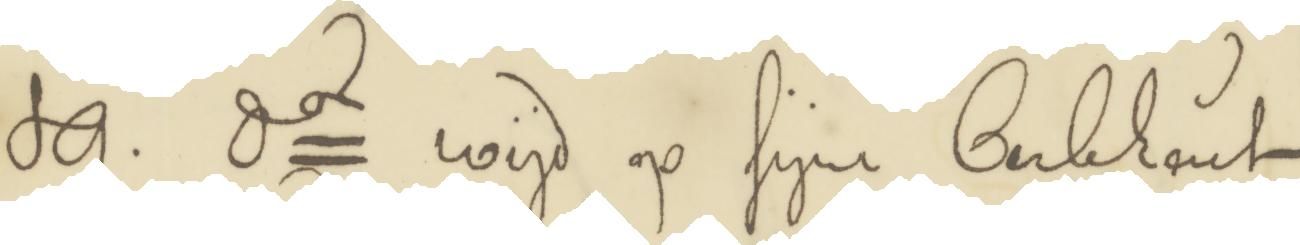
19. d=os wijd op sijn berkhout
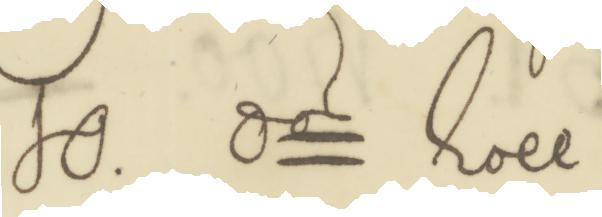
10. d=os holl
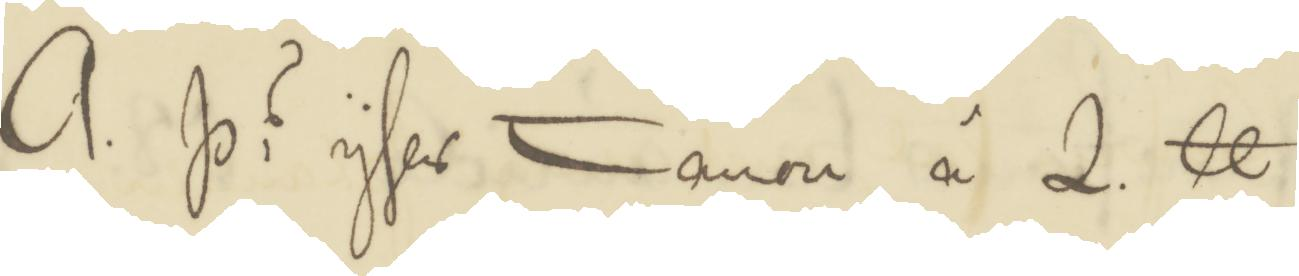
4. p:s ijser Canon â 2. lb:
